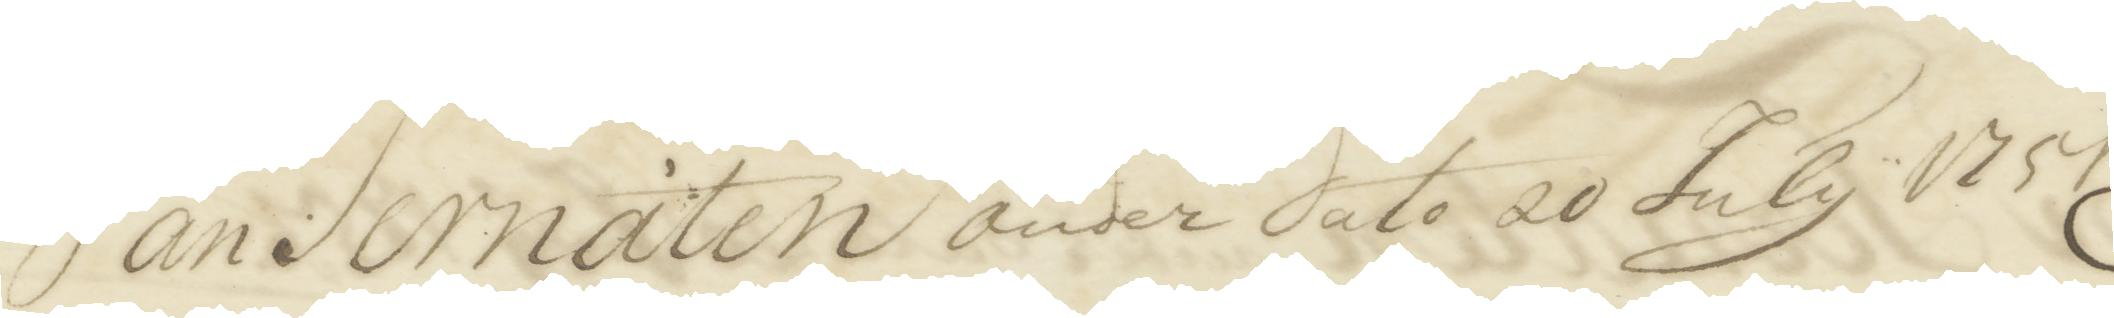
Van Ternaten onder dato 20 Iulij 1751
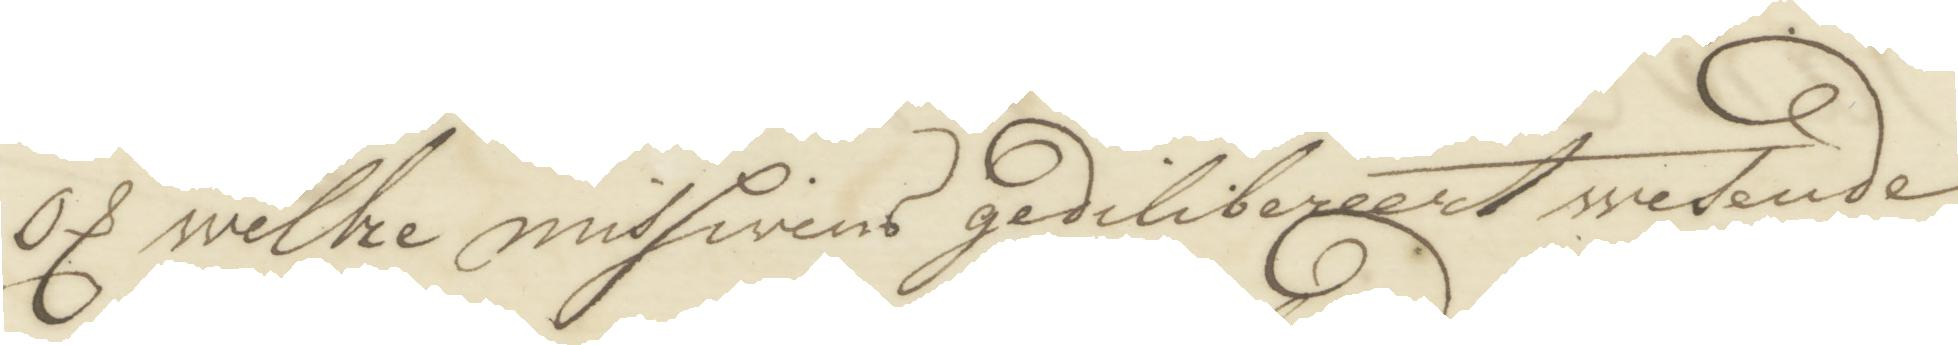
over welke missivens gedilibereert wesende
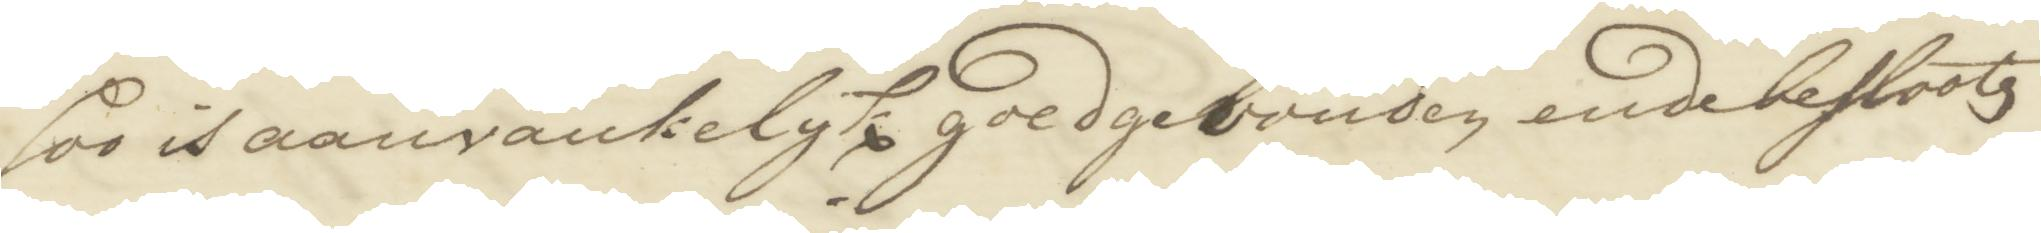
soo is aanvankelijk goedgevonden ende beslooten
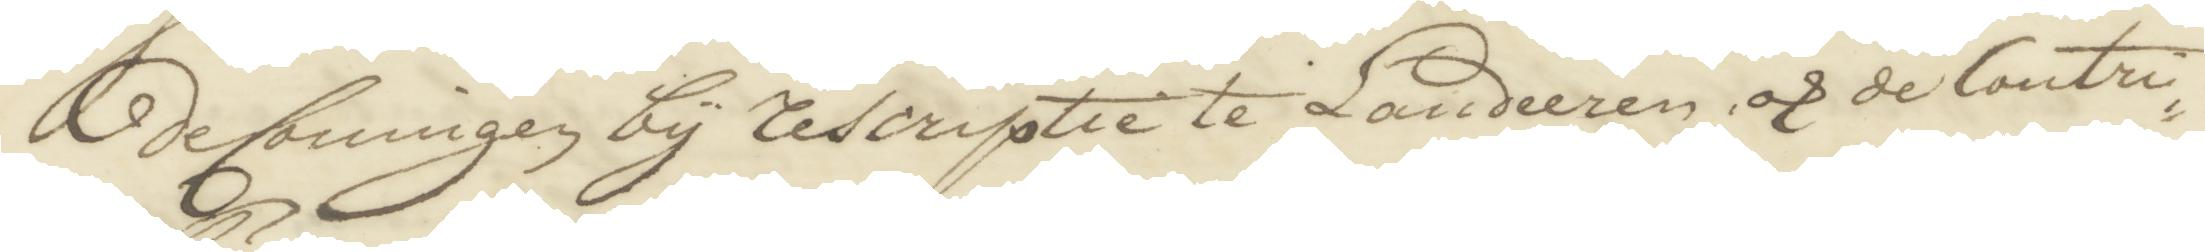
de Coningen bij rescriptie te Landeeren, over de contri„
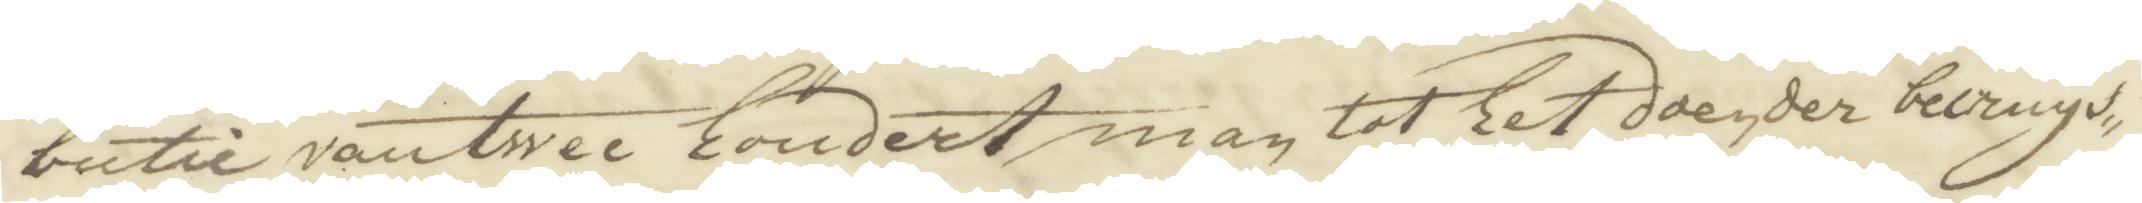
butie van twee hondert man tot het doen der becruijs„
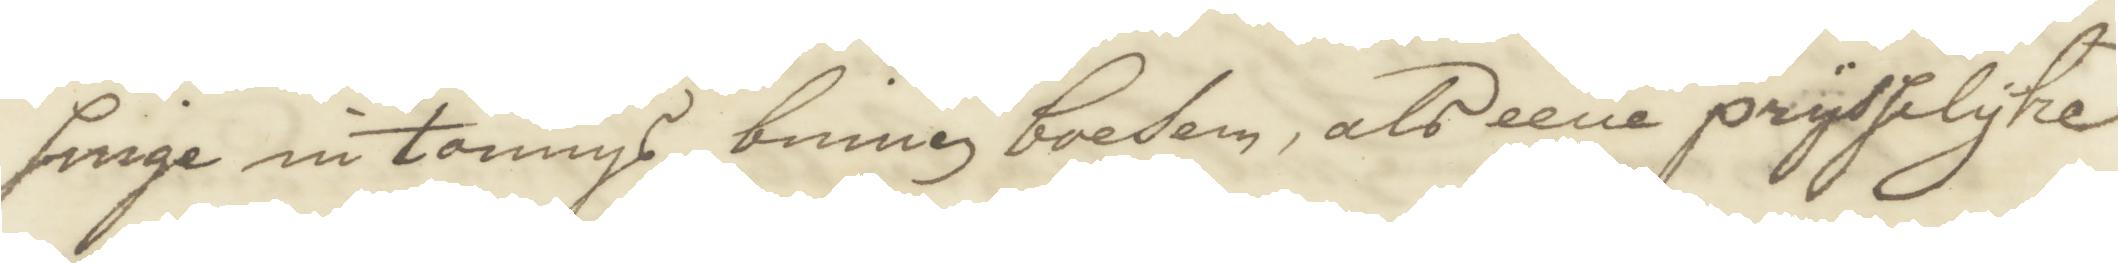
singe in tonnijs binnen boesen, als eene prijsselijke
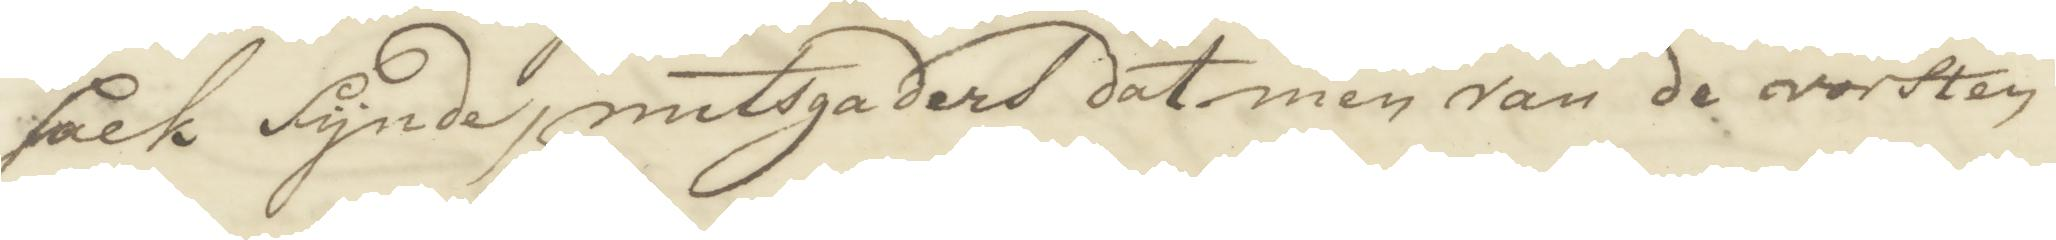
saek sijnde, mitsgaders dat men van de vorsten
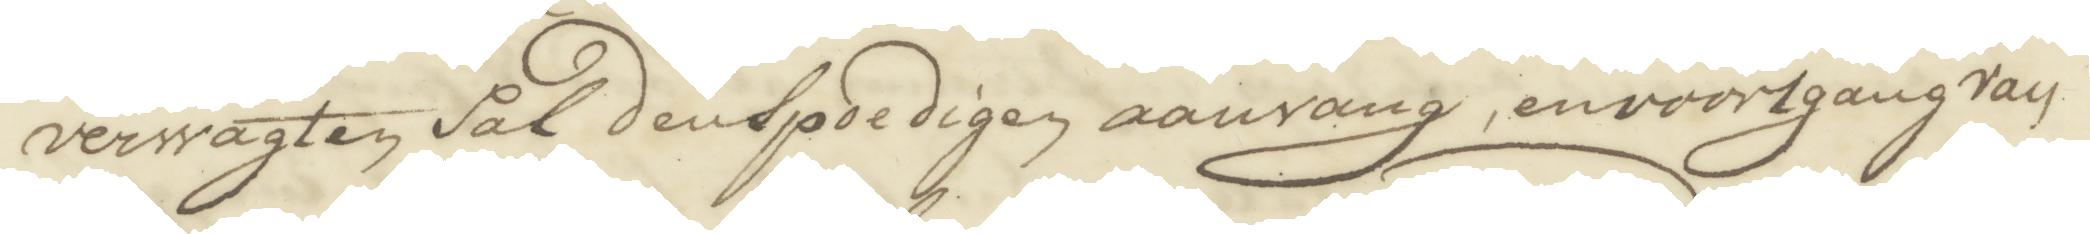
verwagten sal denspoedigen aanvang, en voortgang van
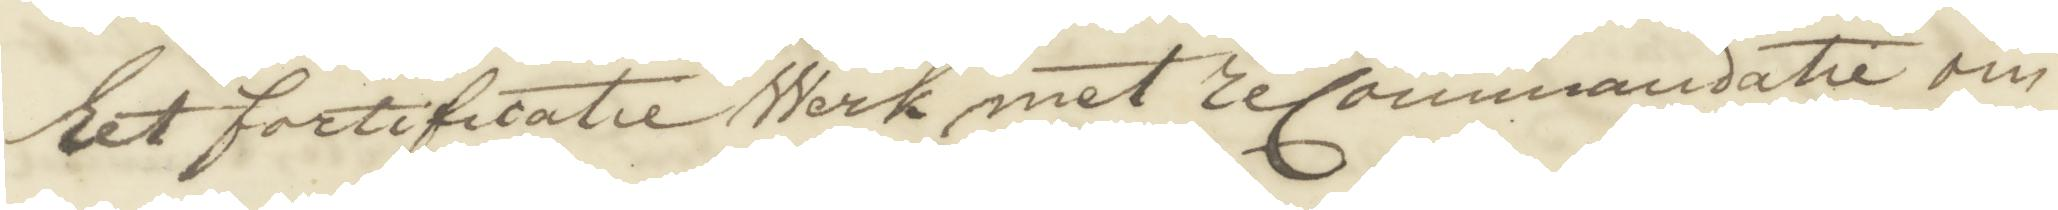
het fortificatie werk met recommandatie om
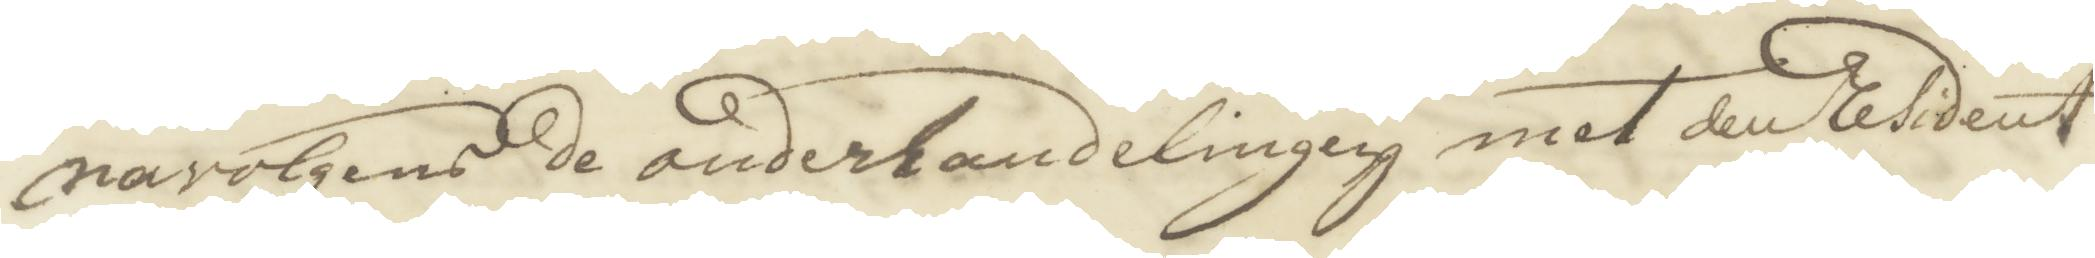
navolgens de onderhandelingen met den resident
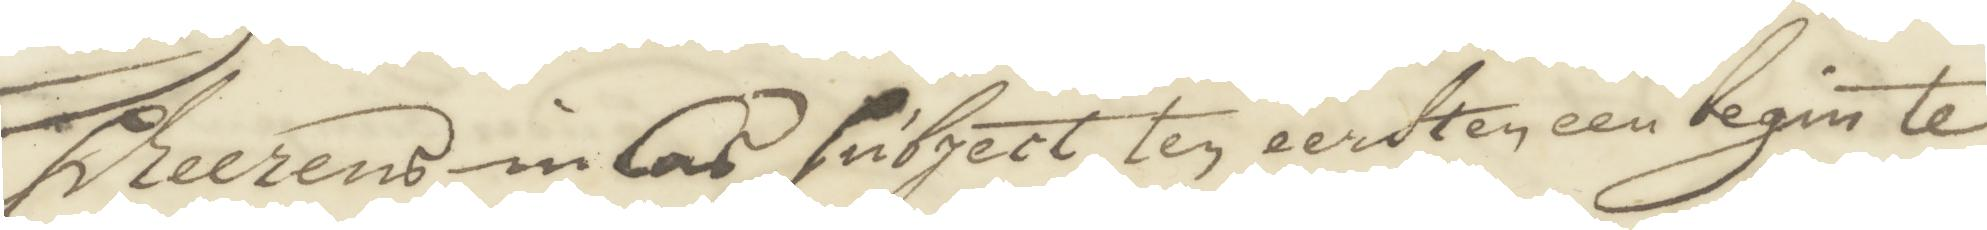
scheerens in Cas subject ten eersten een begin te
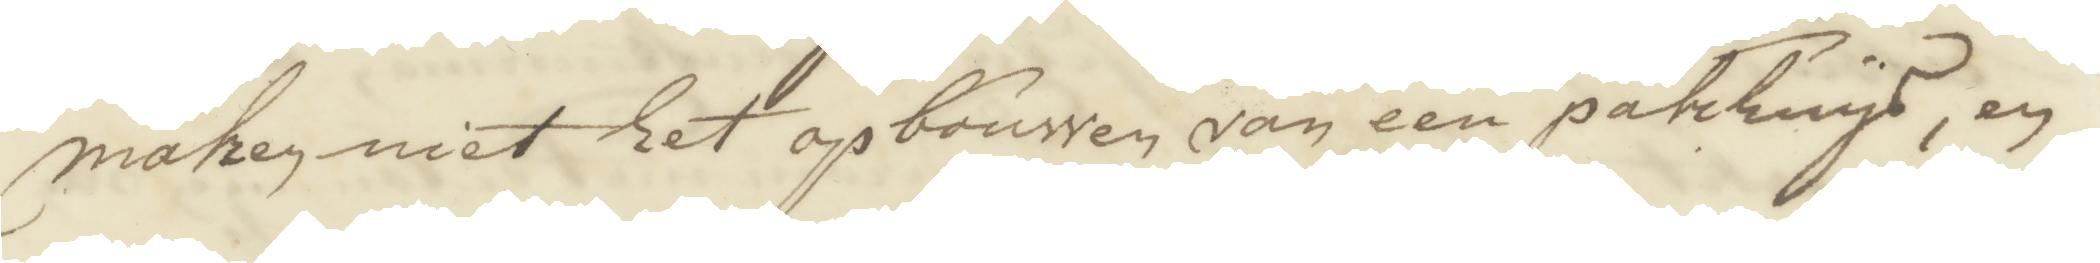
maken met het opbouwen van een pakhuijs, en
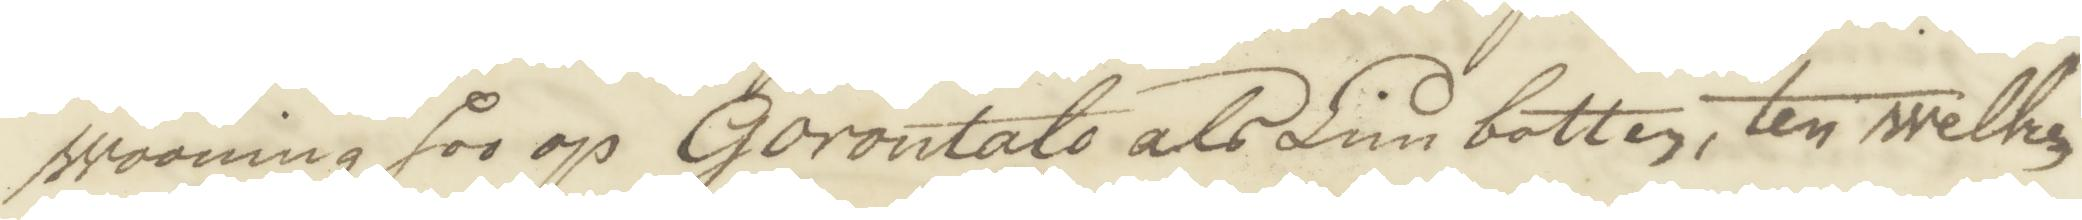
wooning soo op Gorontalo als Limbotten, ten welken
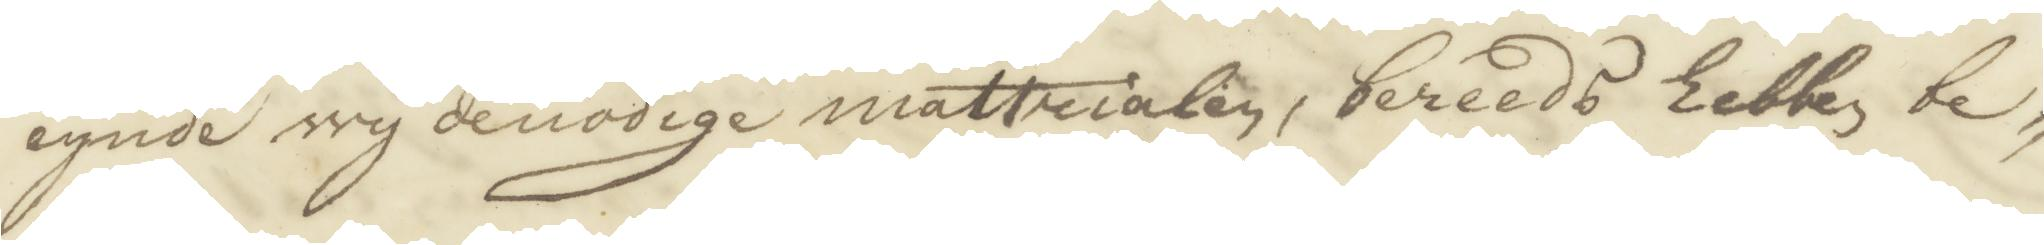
eijnde wij de nodige mattrialen, bereeds hebben be
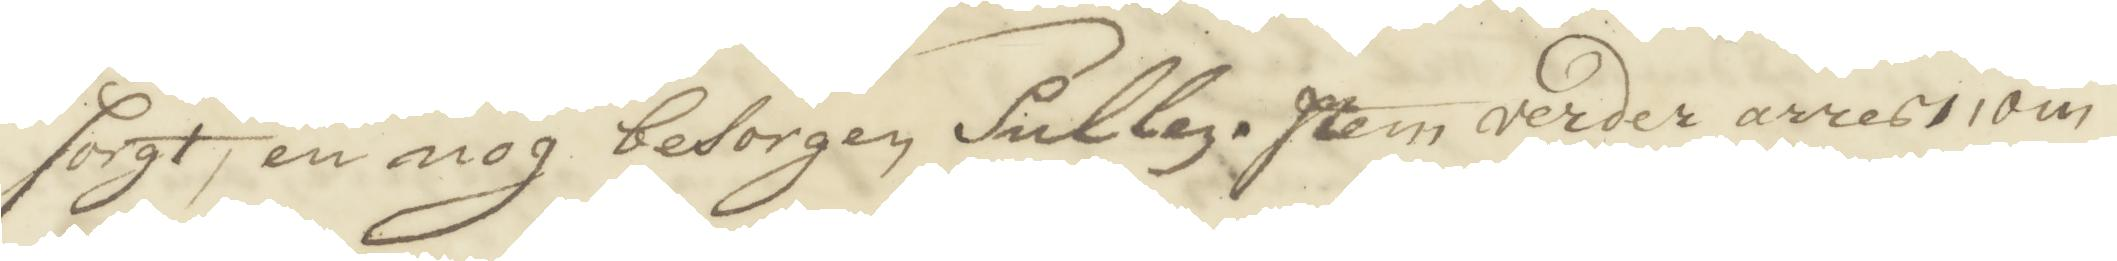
sorgt, en nog besorgen sullen jtem verder arrest, om
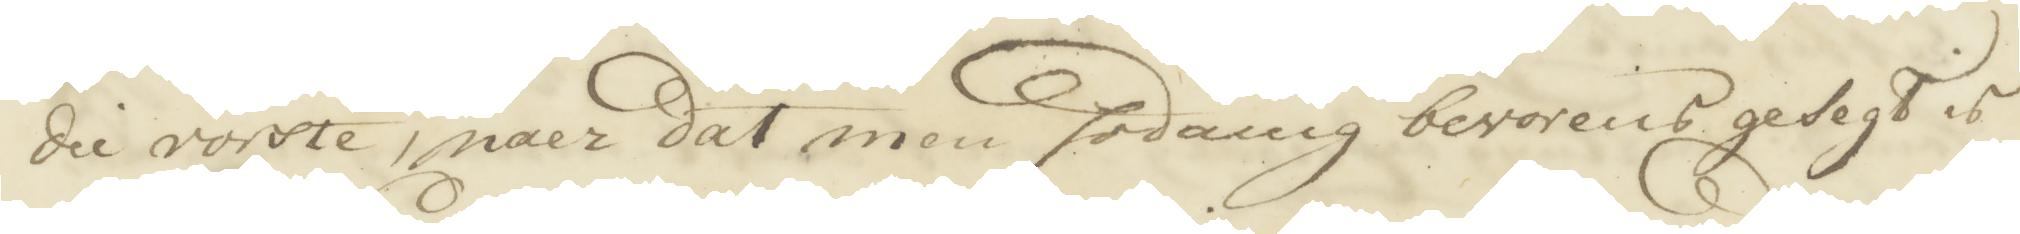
die vorste, naer dat men sodanig bevorens gesegt is
